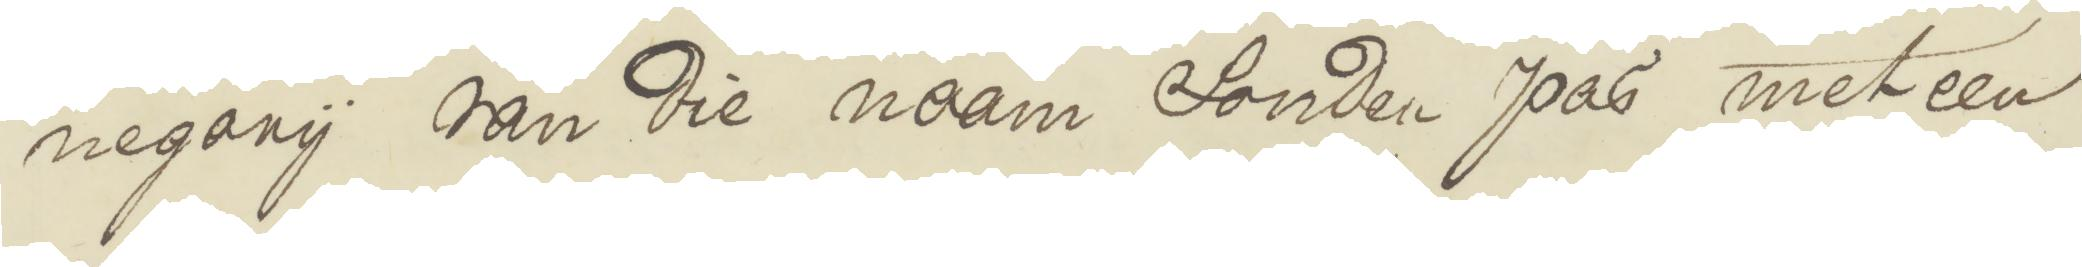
negorij van die naam Sonder pas met een
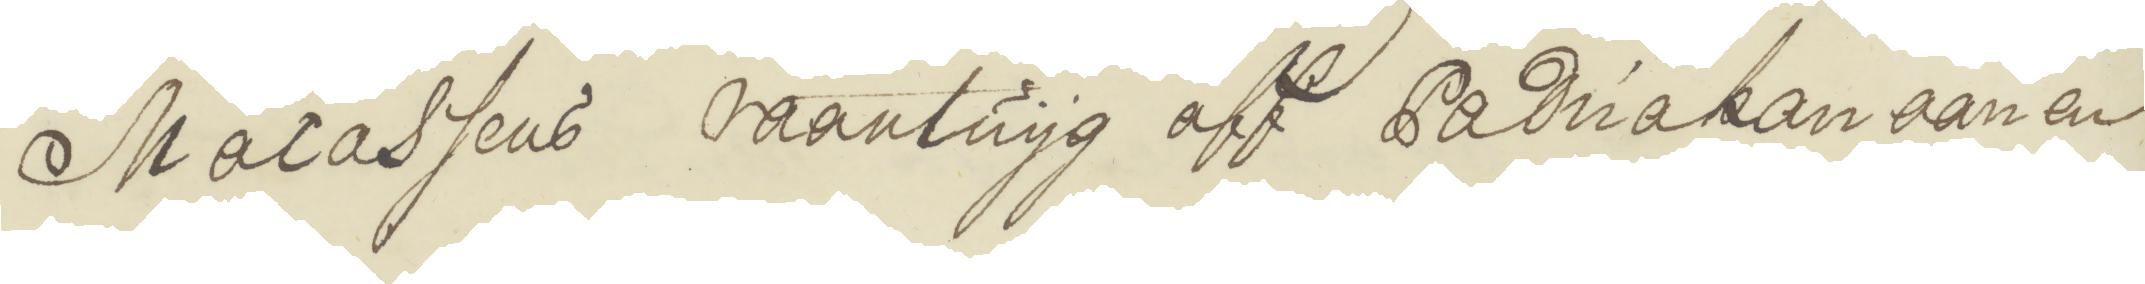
Macassers vaartuijg aff Paduakan aan en
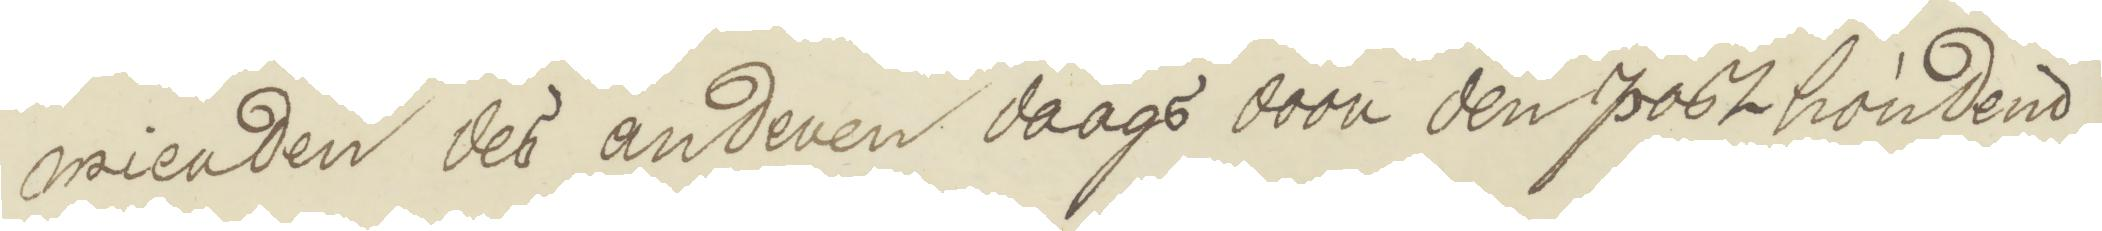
wierden des anderen daags door den post houdend
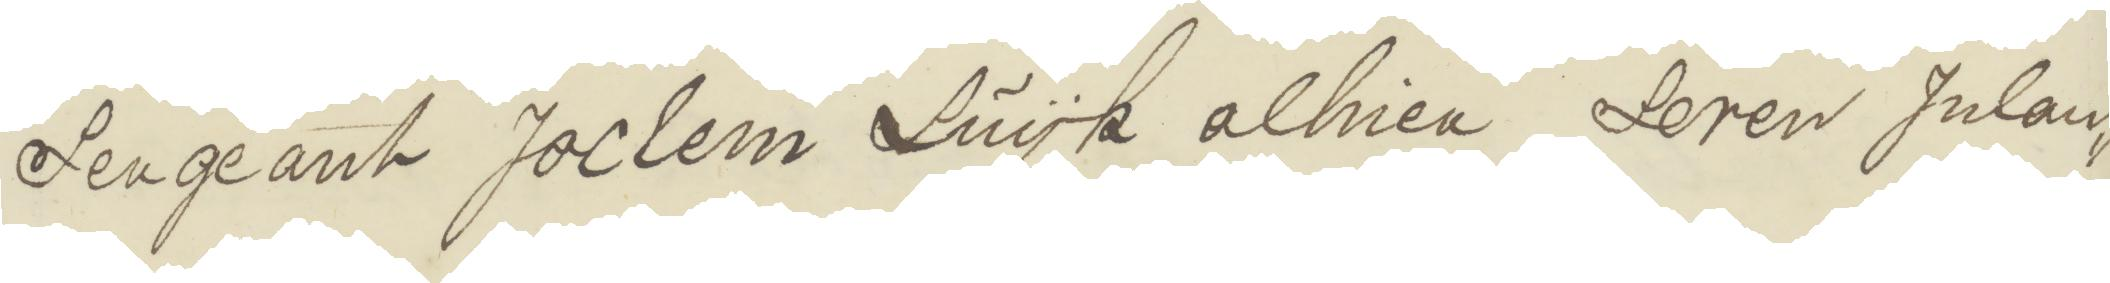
sergeant Jochem Luijk alhier seven Jnlan
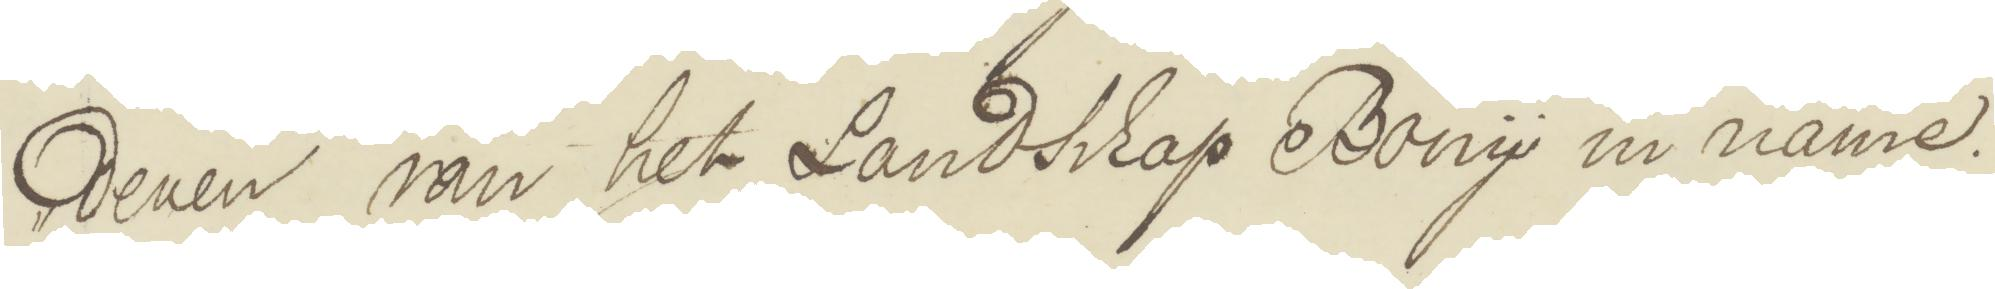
„deren van het Landschap Bonij in name.
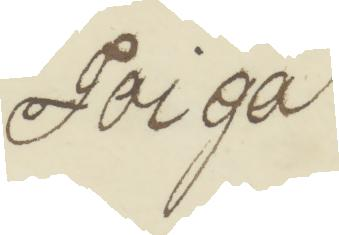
Toiga
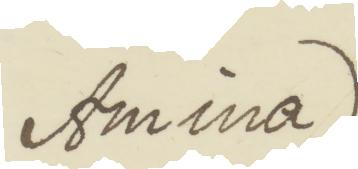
Amina
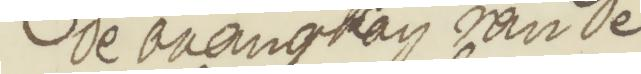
de orangkaij van de
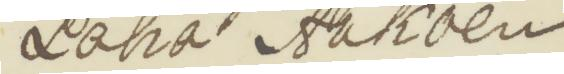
Saha Arkoen
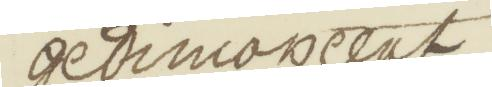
gedimoveert
